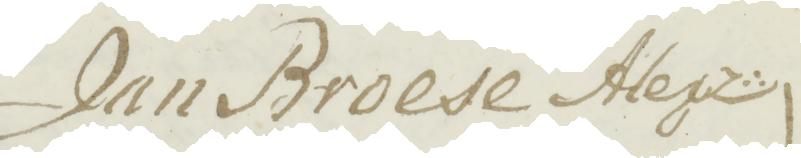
Jan Broese Alexz
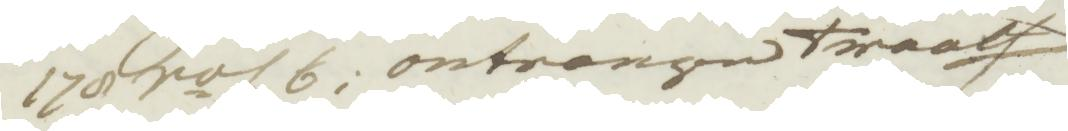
178 v=o C 6; ontvangen twaalf
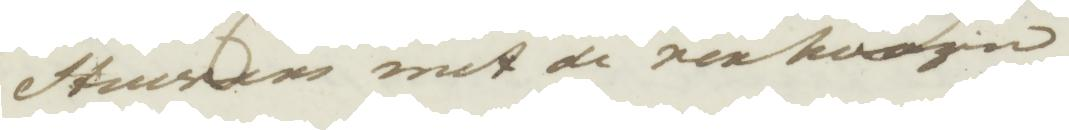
stuivers met de verhoogin
